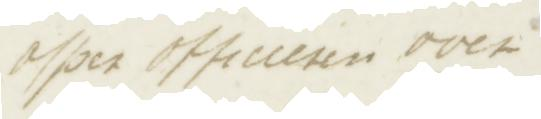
opper officieren over
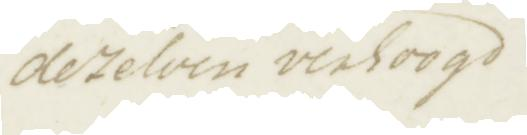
dezelven verhoogd
